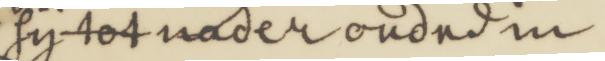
sij tot nader ordre in
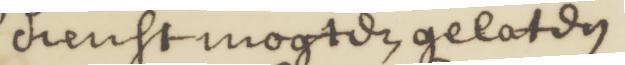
dienst mogten gelaten
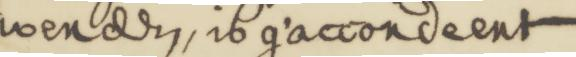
werden, is g'accordeert
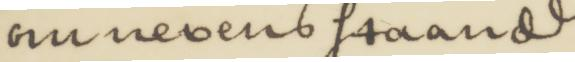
om nevens staande
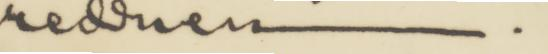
redenen.
